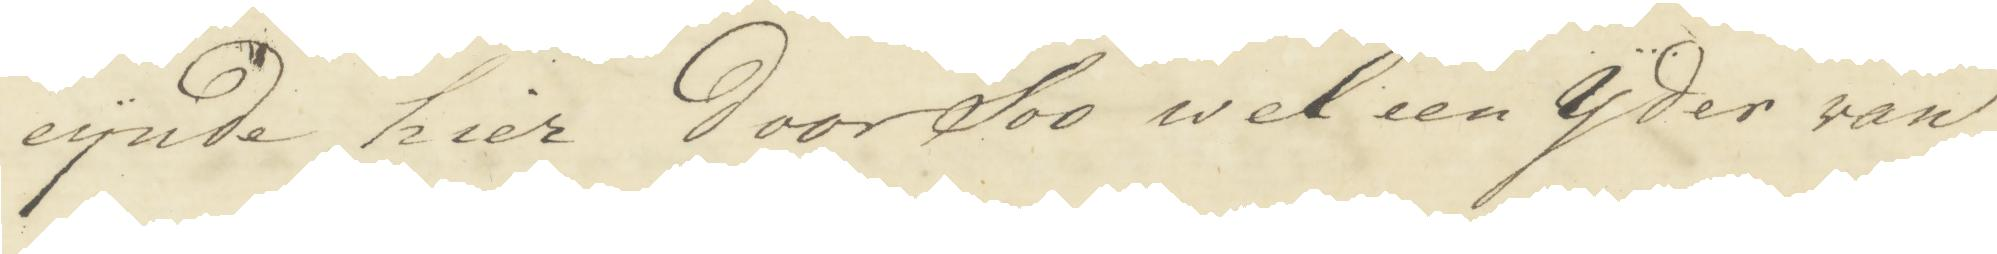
eijnde hier door soo wel een ijder van
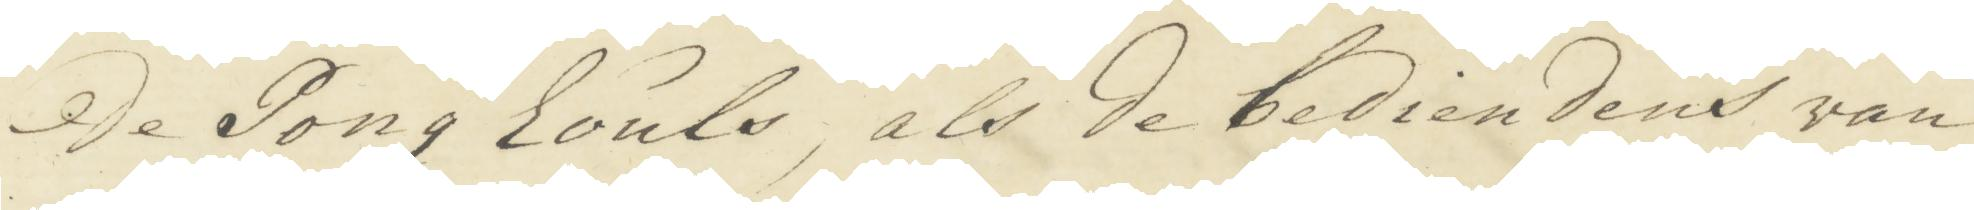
de Pong houls, als de bediendens van
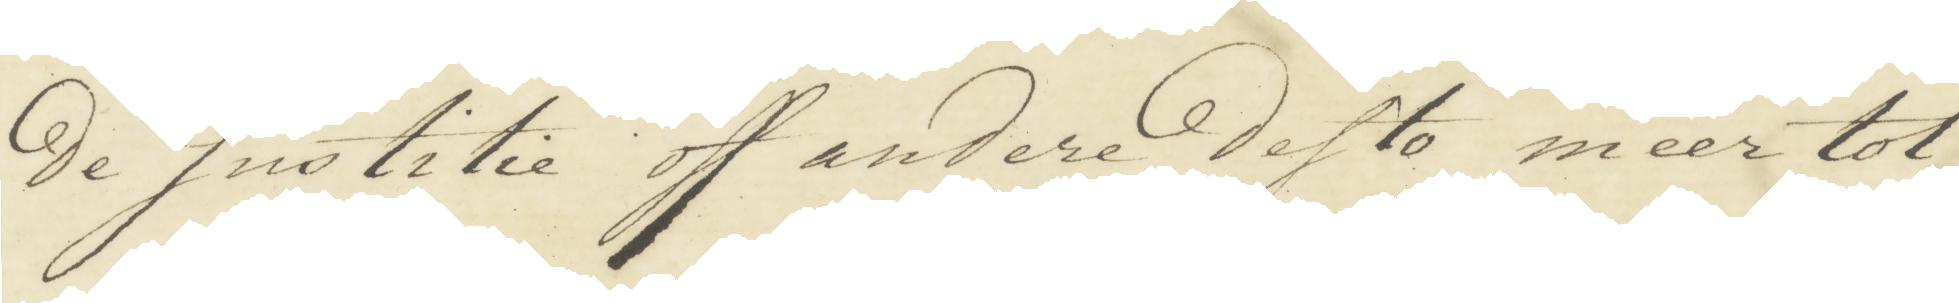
de Justitie off andere desto meer tot
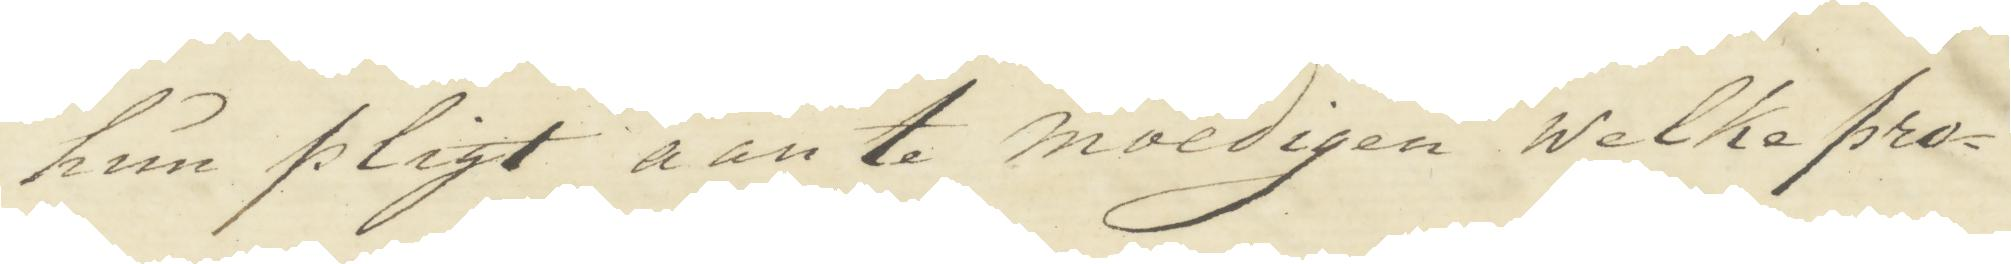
hun pligt aan te moedigen welke pro=
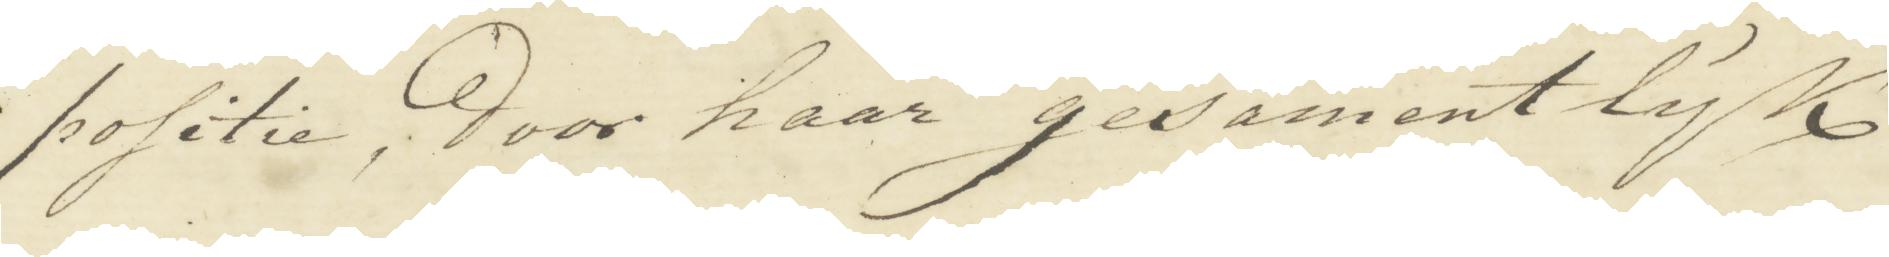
positie, door haar gesamentlijk
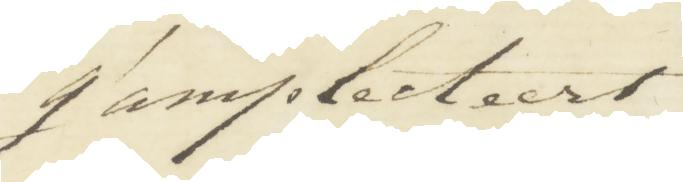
g'amplecteert
